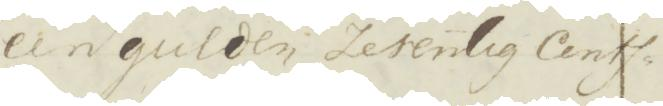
een gulden Zeventig Cents„
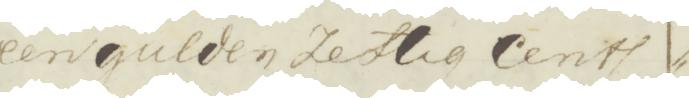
een gulden Zestig Cents „
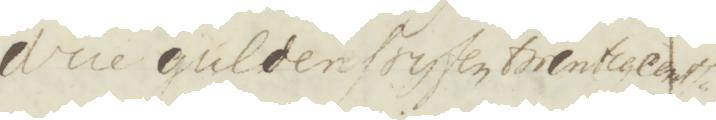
drie gulden vyfen twintig cents
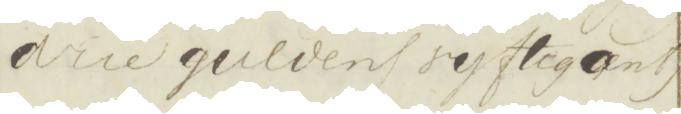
drie guldens vyftig cents
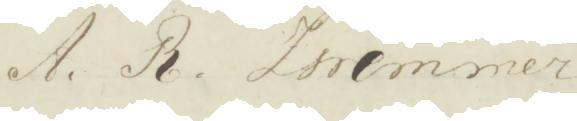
A:R. Zwemmer
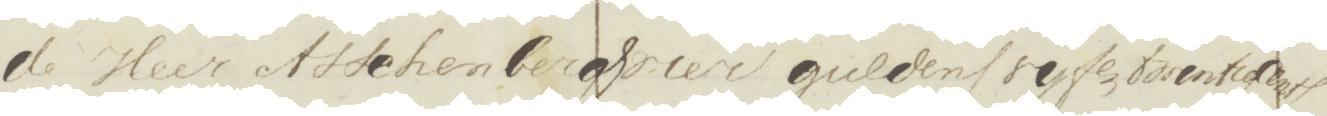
de Heer Asschenberg vier guldens vyfen twintig Cents
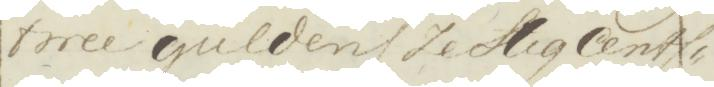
twee guldens Zestig cents„
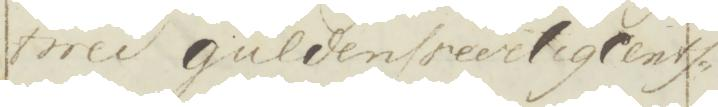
twee guldens veertig cents
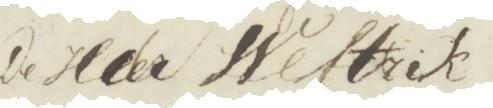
De Heer Westrik
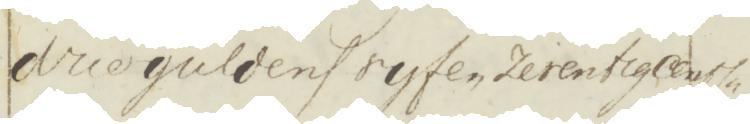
drie guldens vyf en zeventig Cents„
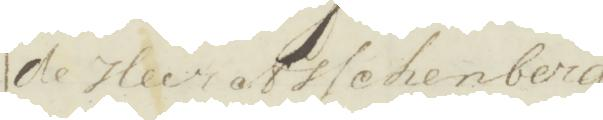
de Heer Asschenbergh
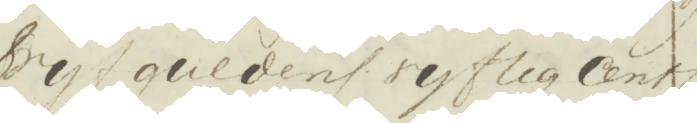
vyf guldens vyftig cents
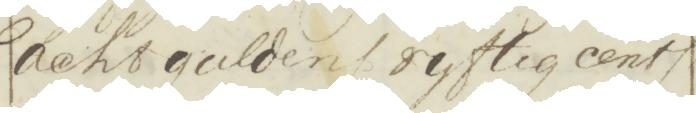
acht guldens vyftig cents
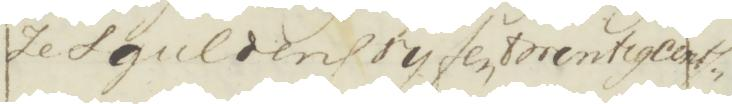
Zes guldens vyfentwintig cents„
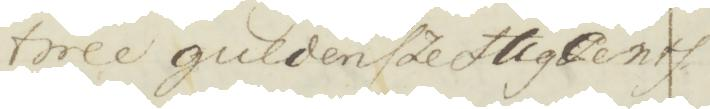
twee guldens zestig cents
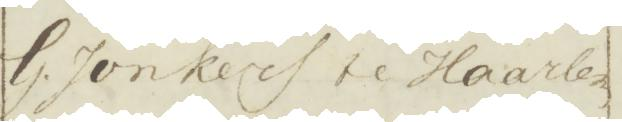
G. Jonkers te Haarlem
